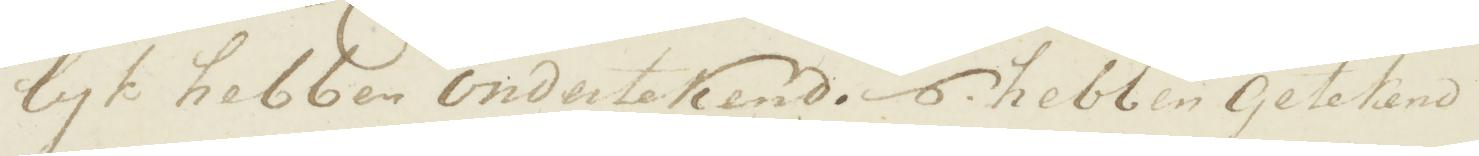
lyk hebben ondertekend. & hebben getekend
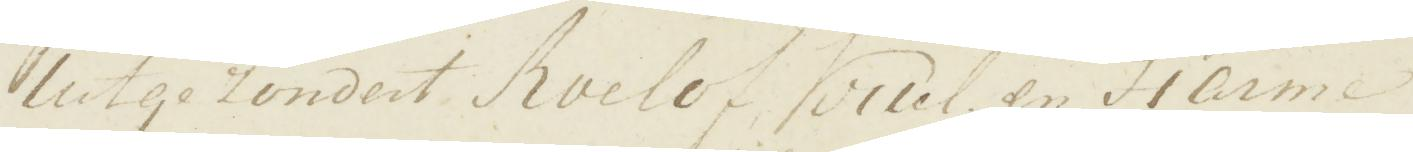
Uitgezondert Roelof Krul. en Harme
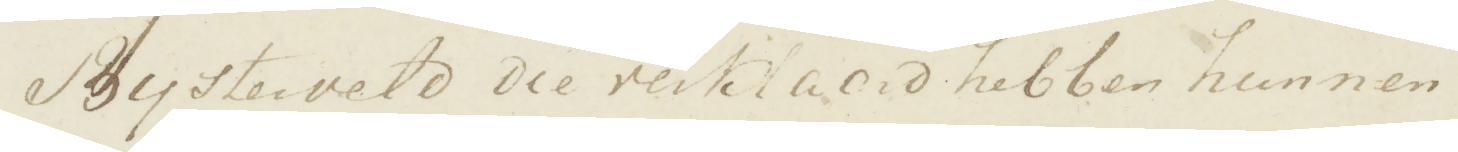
Bijsterveld die verklaard hebben hunnen
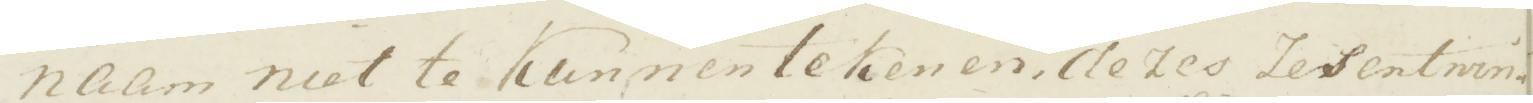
naam niet te kunnen tekenen, dezes Zes en twin„
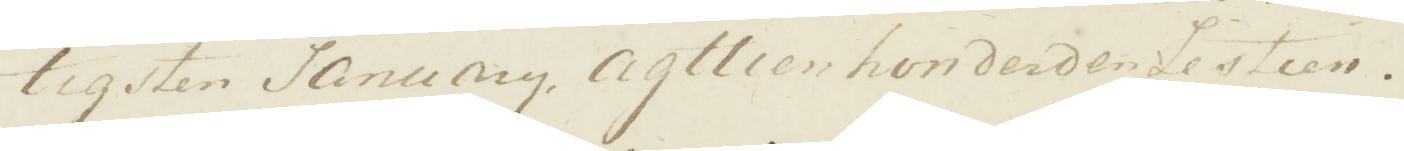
tigsten Ianuary, agttien honderd en Zestien.
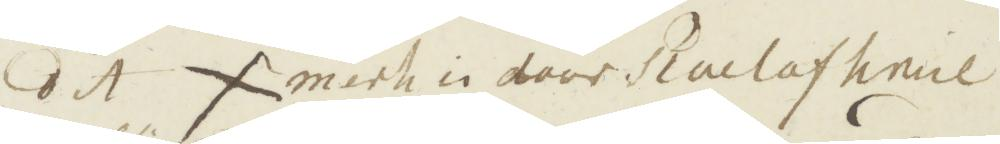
d A x dit merk is door Roelof krul
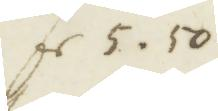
ƒ 5.10
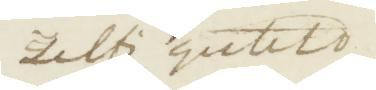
zelfe gesteld
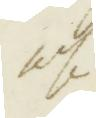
1½
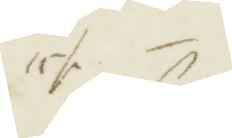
10%
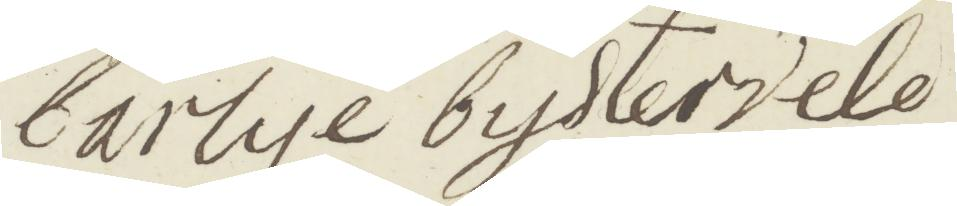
Cartije bystervele
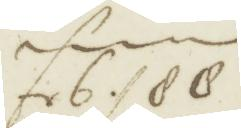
6750
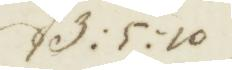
13:5:10
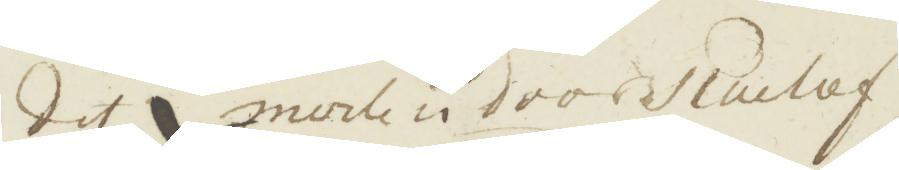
dit x merk is door Roelof
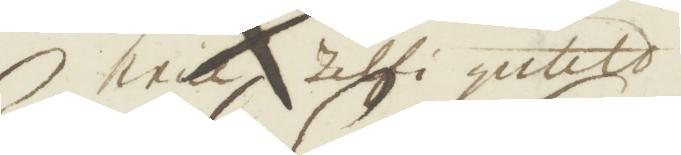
krul, zelfe gesteld
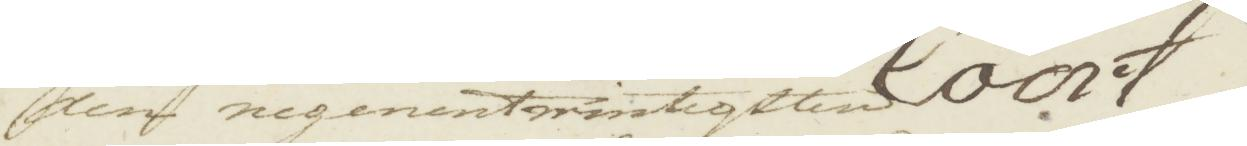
den negenentwintigsten
